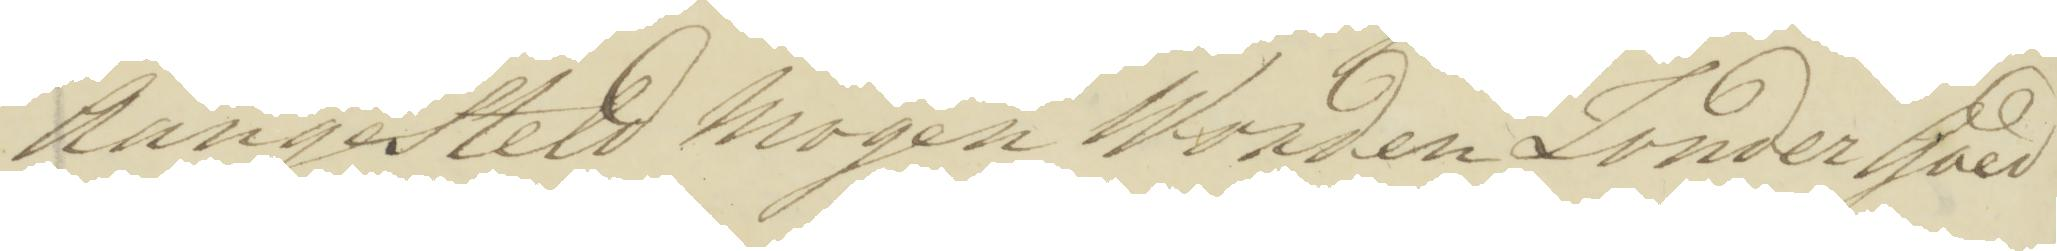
aangesteld mogen worden zonder goed
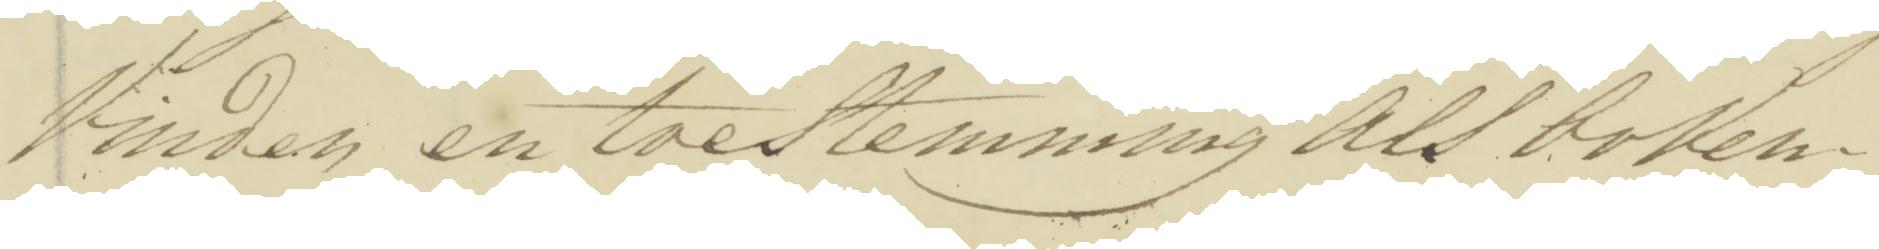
vinden en toestemming als boven.
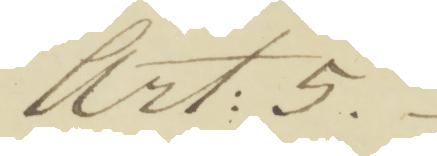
Art: 5.
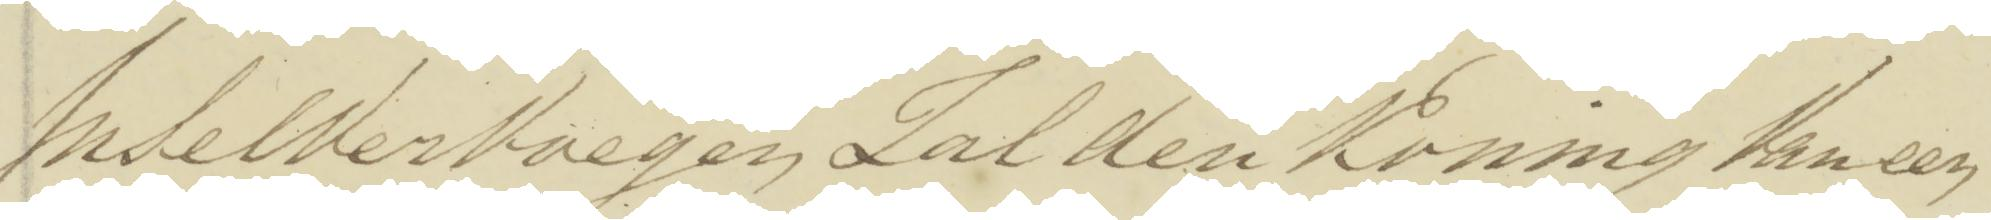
Jnselvervoegen zal den Koning van een
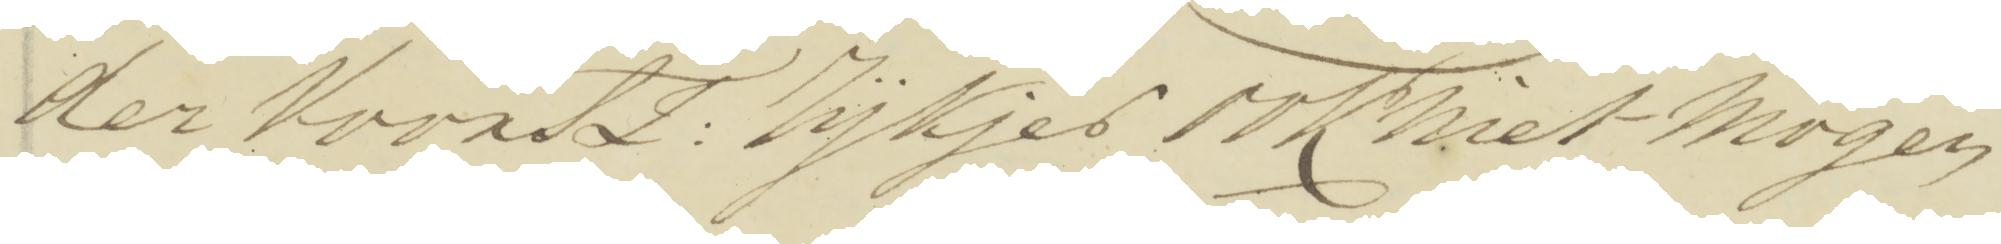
der voorsz: rijkjes ook niet mogen
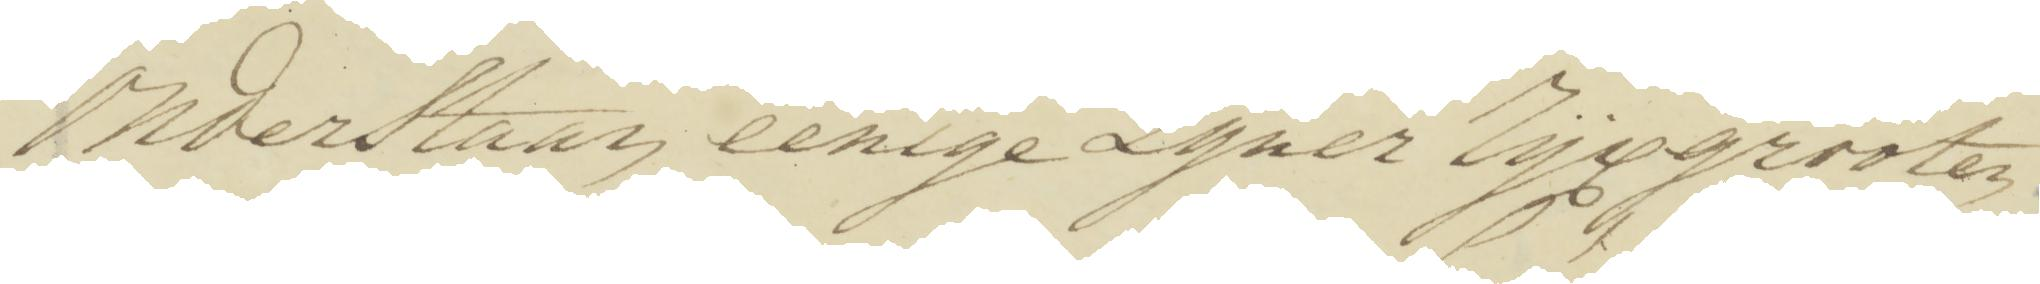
onderstaan eenige zijner rijxgrooten
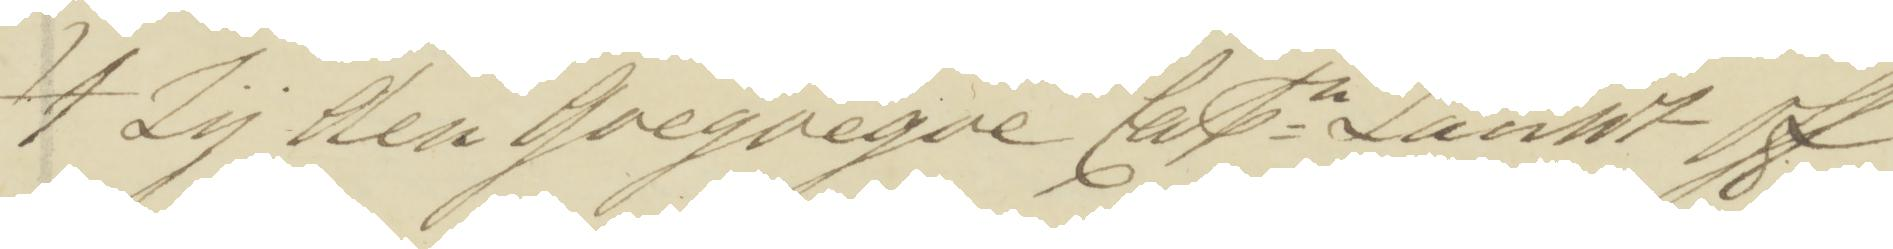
’t zij den goegoegoe Cap=n Lauwt off
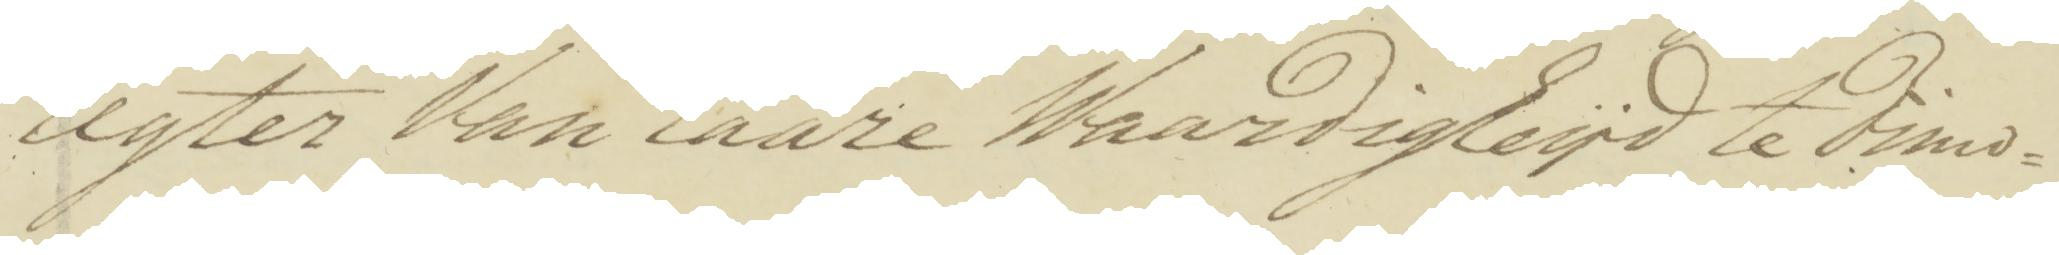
regter van haare waardigheijd te dimo=
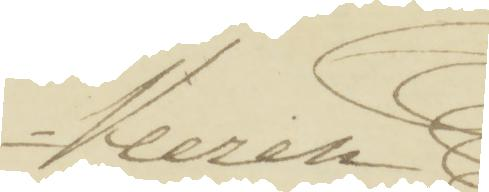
=veeren
